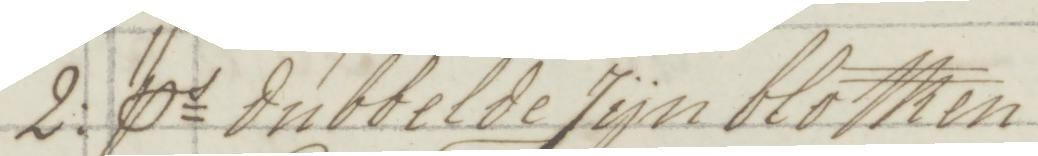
2: p=s dubbelde jijn blokken
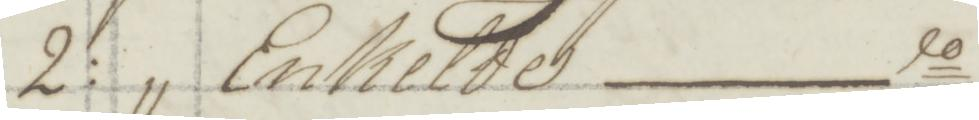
2: „ Enkelde _=o
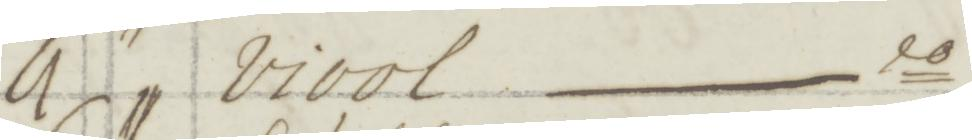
4 „ Viool _=o
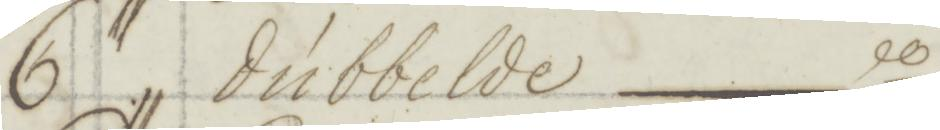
6 „ dubbelde _=o
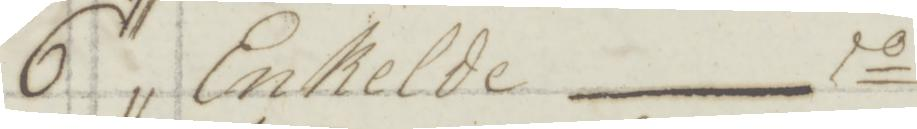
6 „ Enkelde _=o
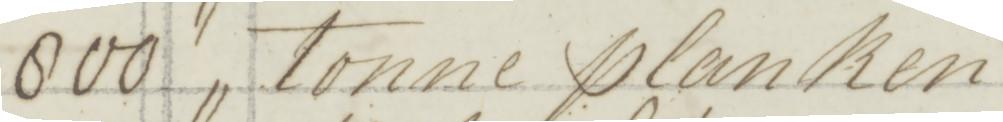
800 „ tonne planken
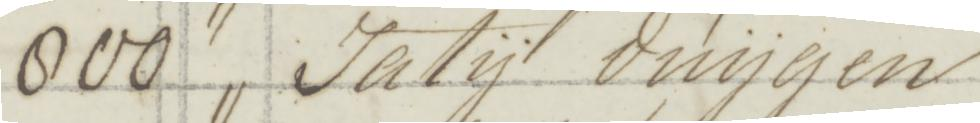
800 „ Jatij duijgen
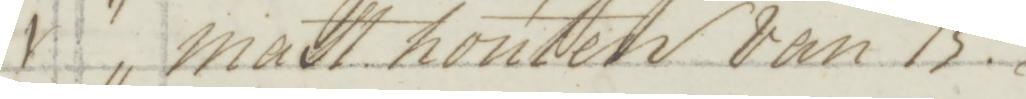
1 „ mast houten van 15:
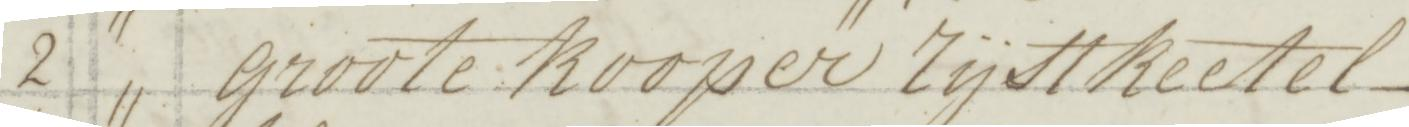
2 „ groote Kooper rijstkeetel
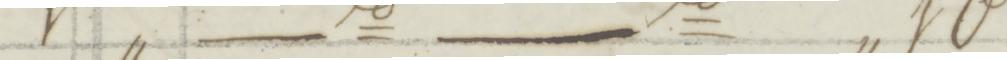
1 „ _=o _=o „10
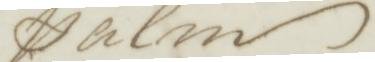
palm
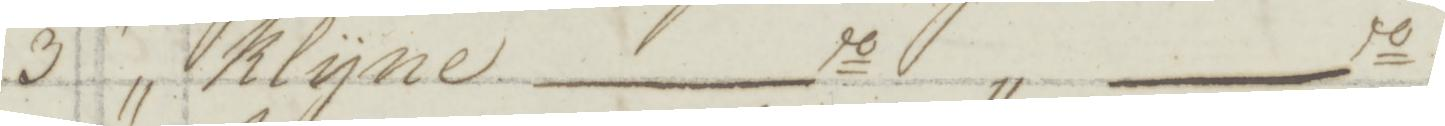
3 „ klijne _=o _=o
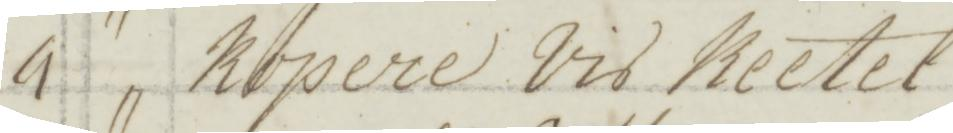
4 „ kopere vis keetel
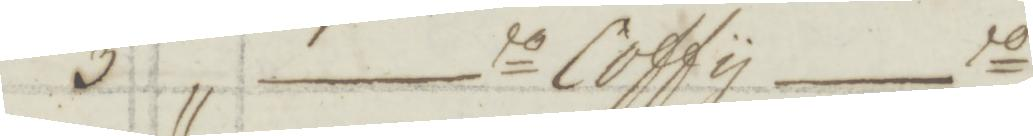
3 „ _=o Coffij _=o
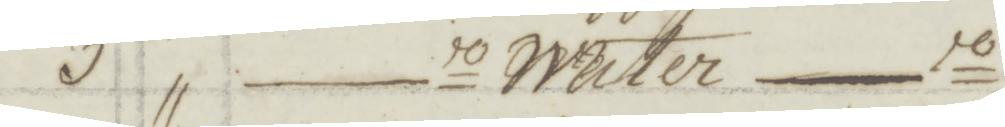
3 „ _=o Water _=o
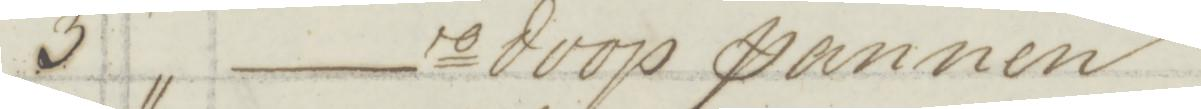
3 „ _=o doop pannen
